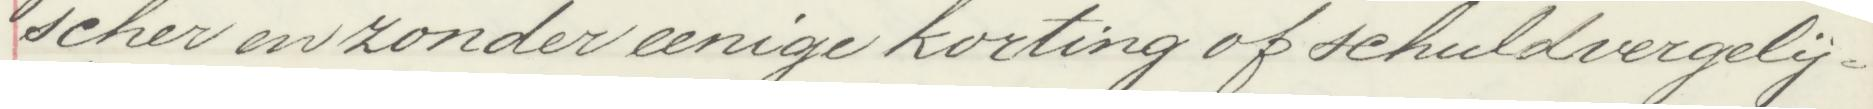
scher en zonder eenige korting of schuldvergelij=
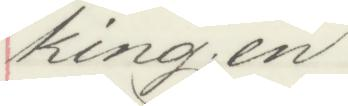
king en
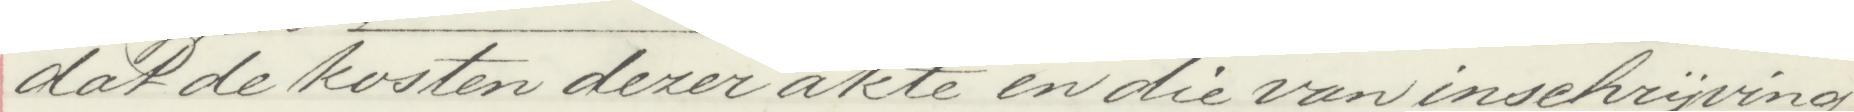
dat de kosten dezer akte en die van inschrijving,
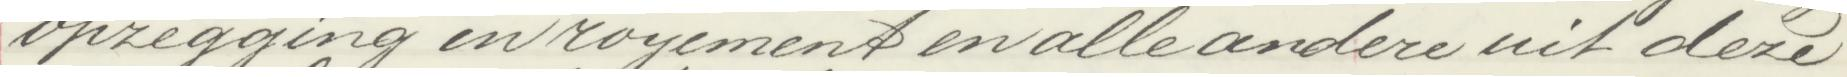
opzegging en royement en alle andere uit deze
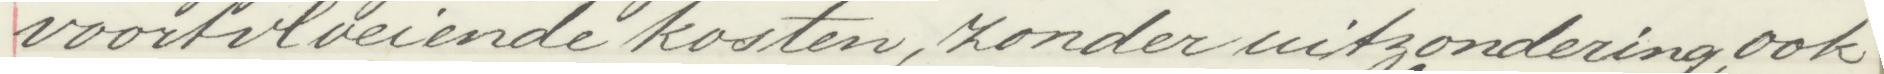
voortvloeiende kosten, zonder uitzondering, ook
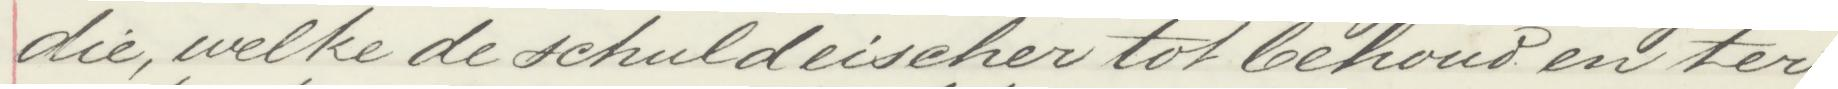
die, welke de schuldeischer tot behoud en ter
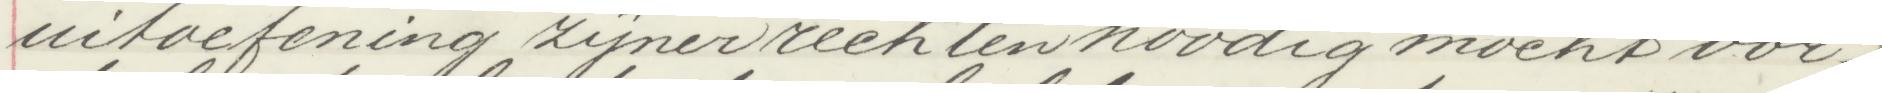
uitoefening zijner rechten noodig mocht oor=
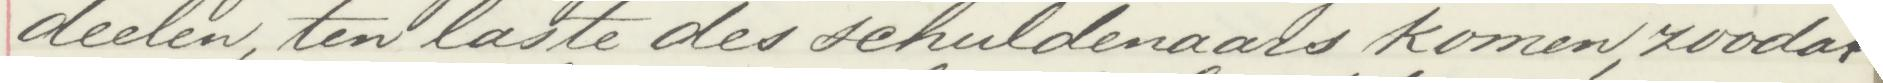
deelen, ten laste des schuldenaars komen, zoodat
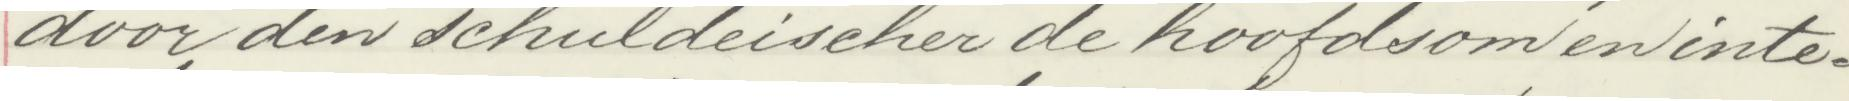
door den schuldeischer de hoofdsom en inte„
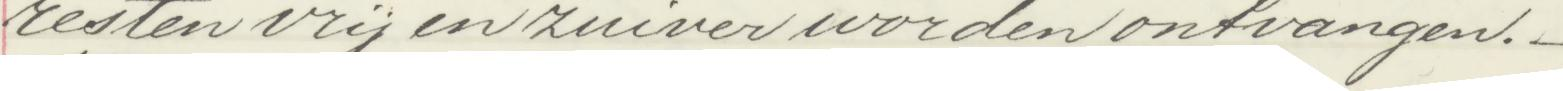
resten vrij en zuiver worden ontvangen.
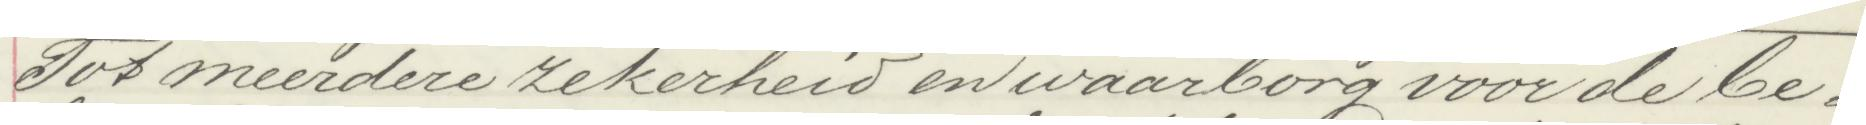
Tot meerdere zekerheid en waarborg voor de be=
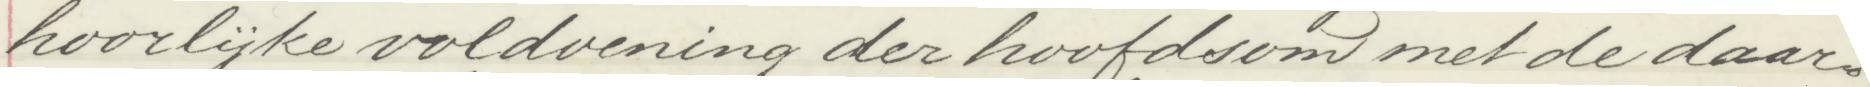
hoorlijke voldoening der hoofdsom met de daar=
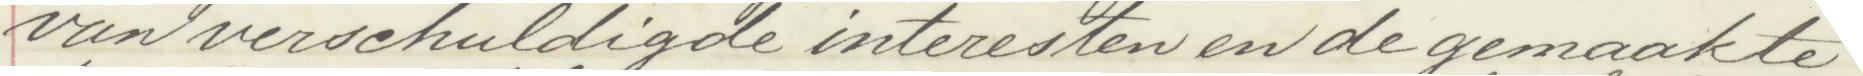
van verschuldigde interesten en de gemaakte
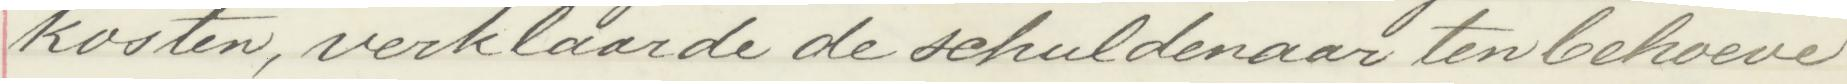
kosten, verklaarde de schuldenaar ten behoeve
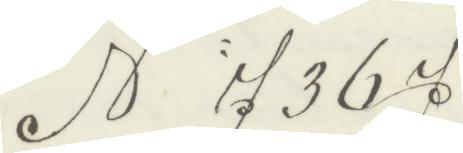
N=o 7367
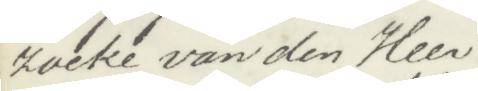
zoeke van den Heer
